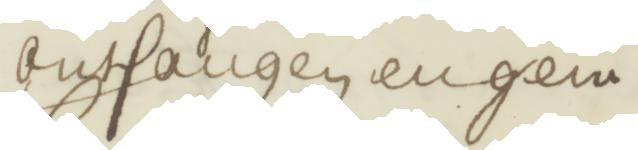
ontfangen en gem
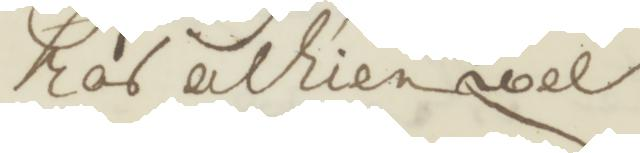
kas alhier wel
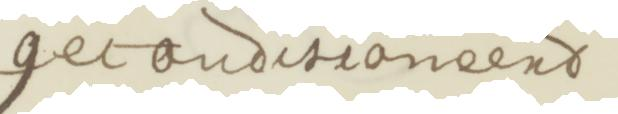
geconditioneerd
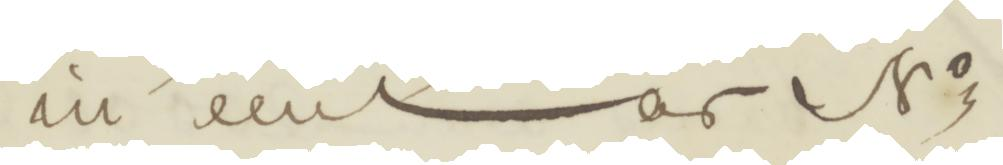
in een Kas N„o
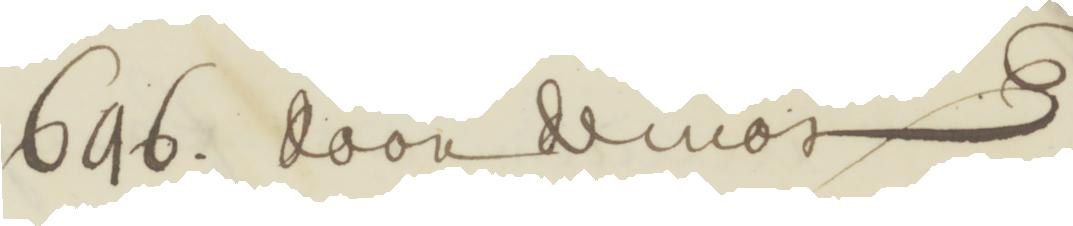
646. door de mot
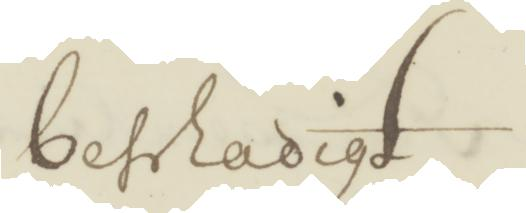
beschadigt
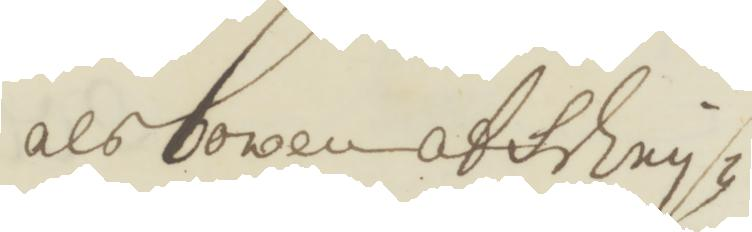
als boven afschrij„
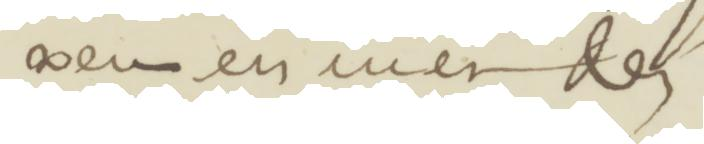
ven en met den
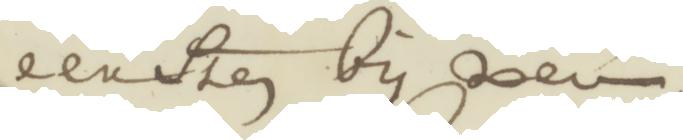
eersten bij ven
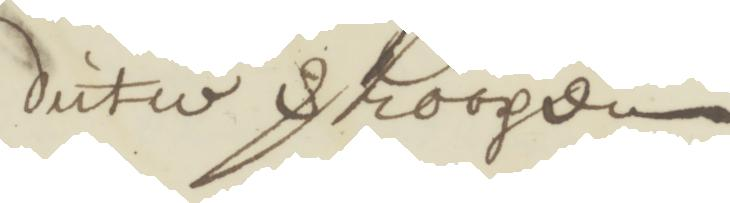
dutie verkoopen
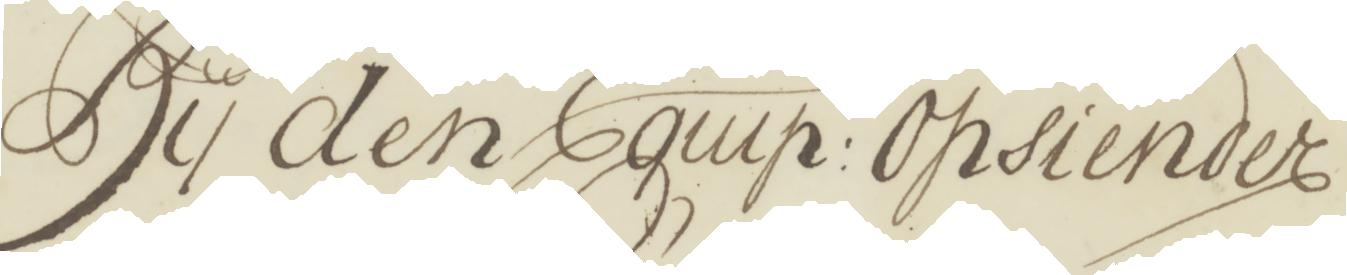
Bij den Equip:s opsiender
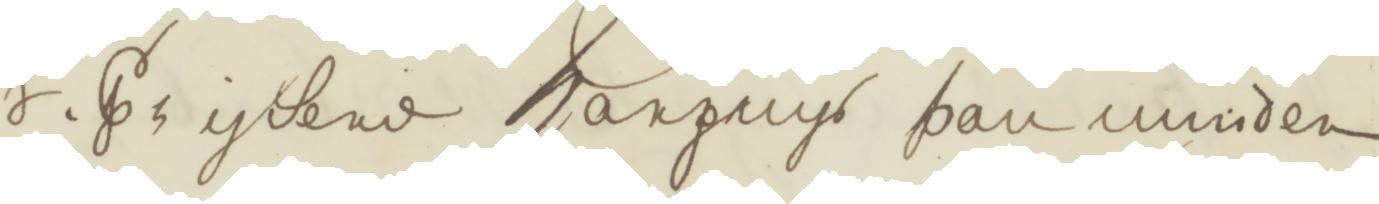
1. p„s ijsere Harpuijs van minder
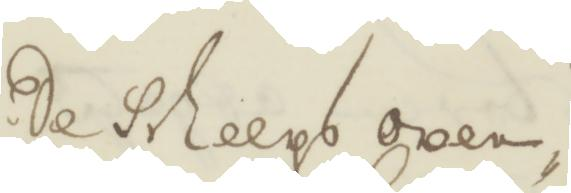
de scheeps over„
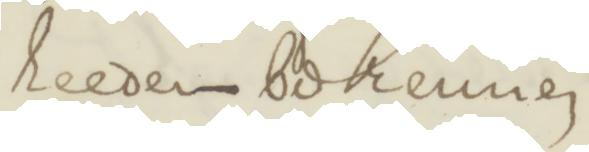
heeden bekennen
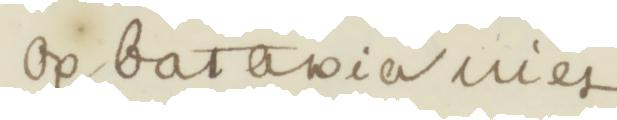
op batavia niet
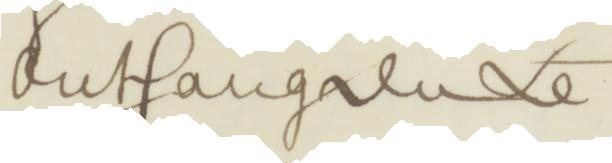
ontfangen te
